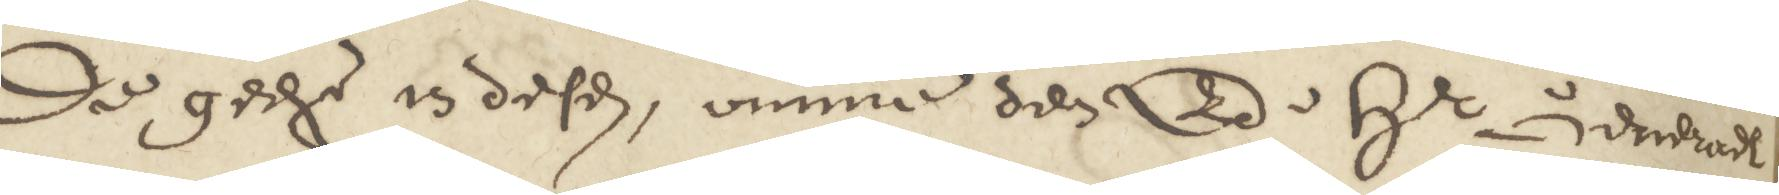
De gede in desen, omme den Ed' Hr Generael
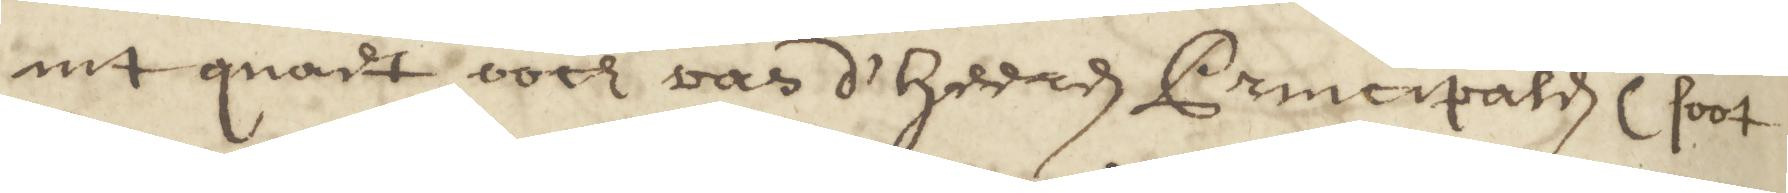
int quaet ooch van d’ Heeren Principalen ( soo t
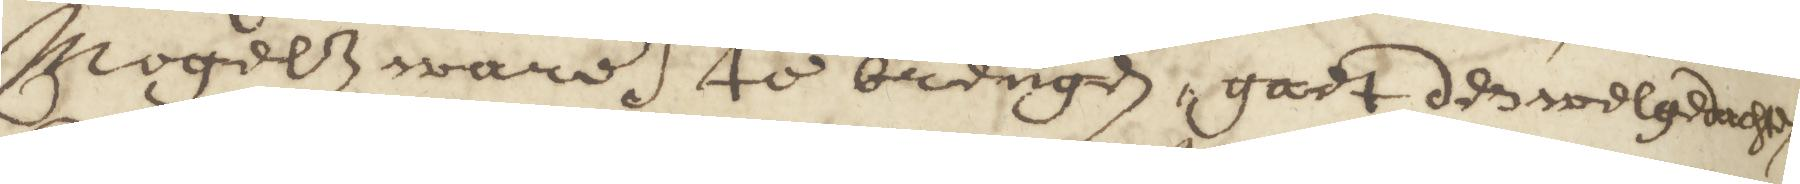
mogelijk ware ) te brengen „ gaet den welgedachten
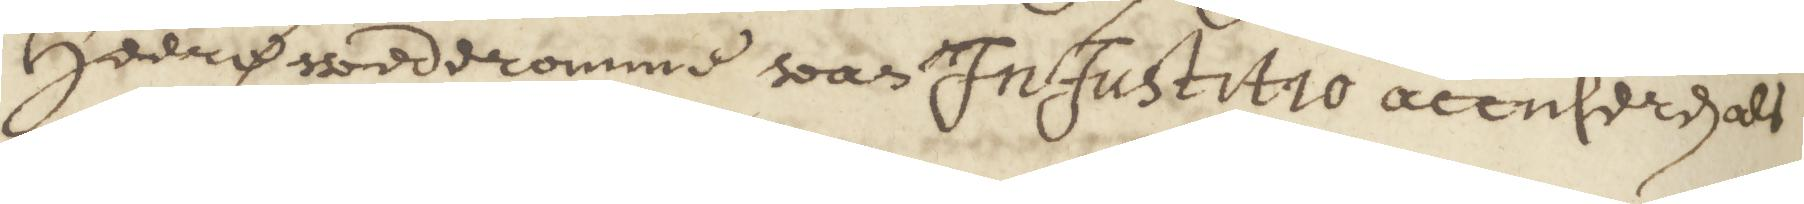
heere wederomme van Jn Justitio accuseren als
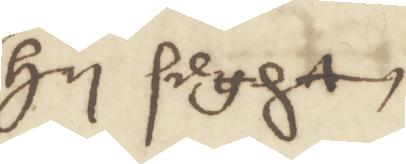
hy seght,
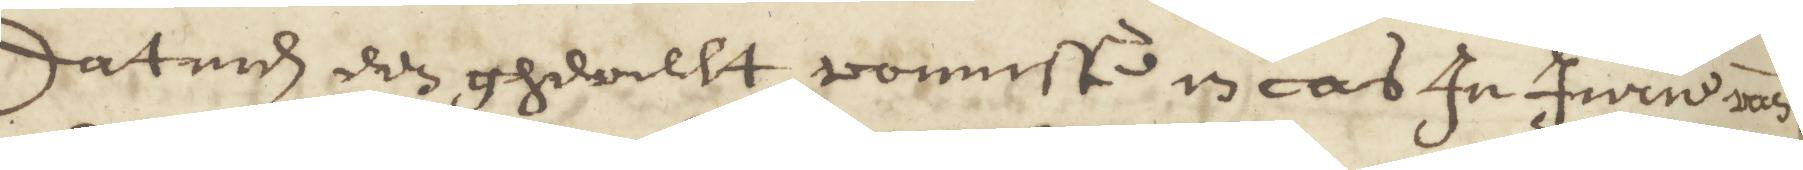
Dat men een ghevelt vonnisse in cas Jn Jurie van
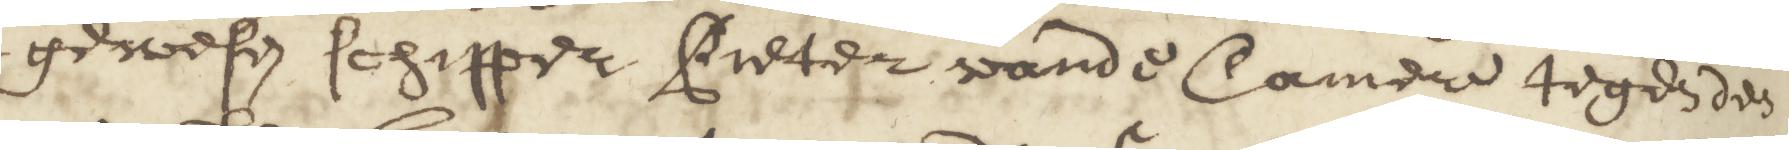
gewesen schipper Pieter vande Camere tegen den
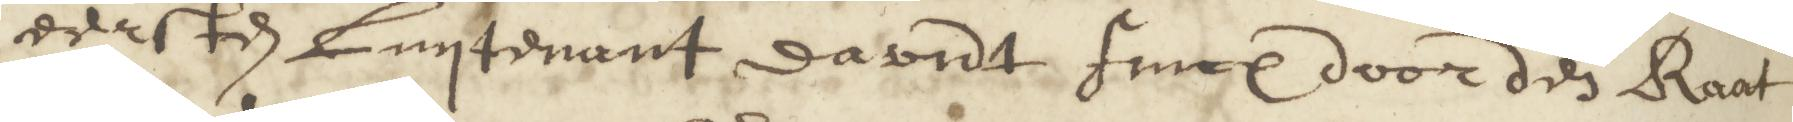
eersten Luytenant davidt fincx door den Raat
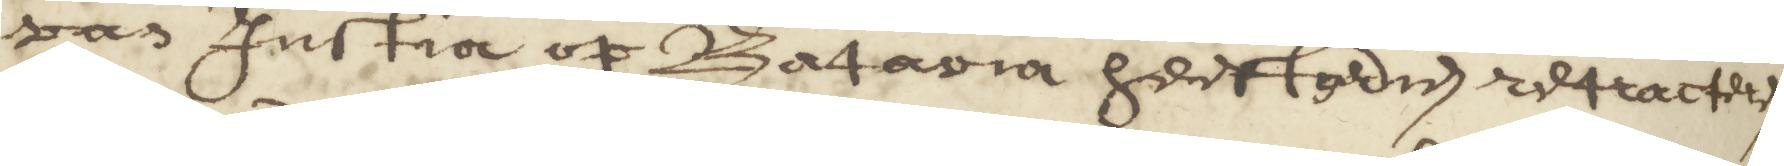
van Justia op Batavia heeft gedien retracteren
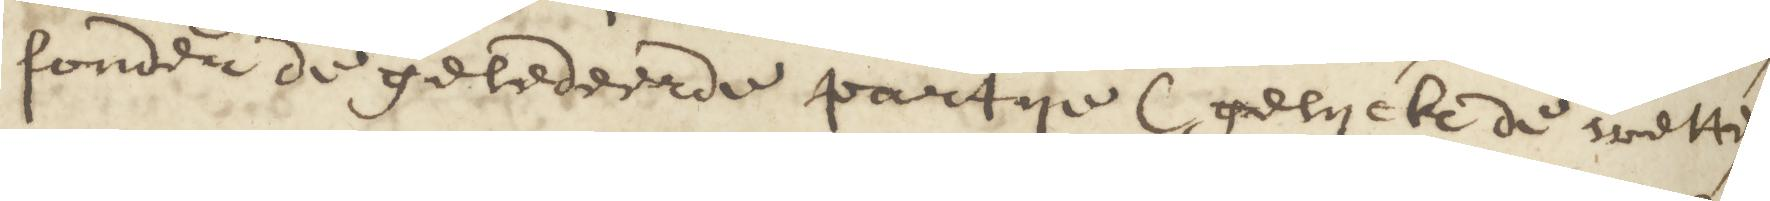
sonder de geledeerde partye ( gelyck de wetten
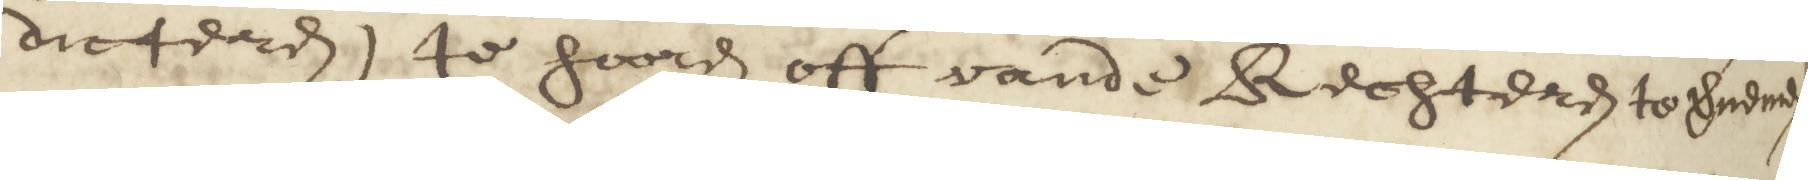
dicteren ) te hooren off vande Rechteren te vernemen
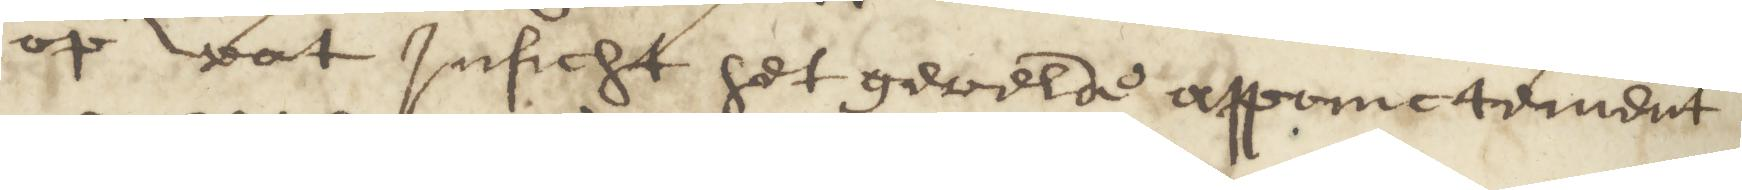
op wat jnsicht het gevelde appoinctement
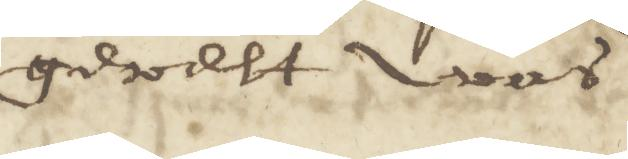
gevelt was
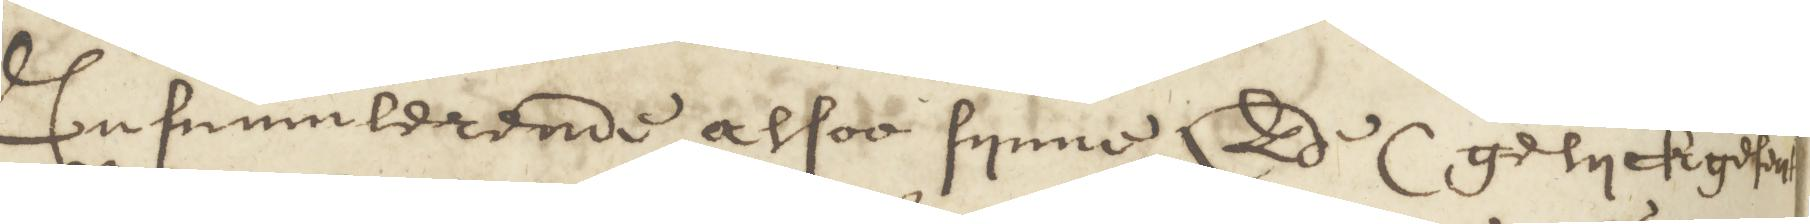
Jnsummeerende alsoo synne Ed' ( gelyck geseyt
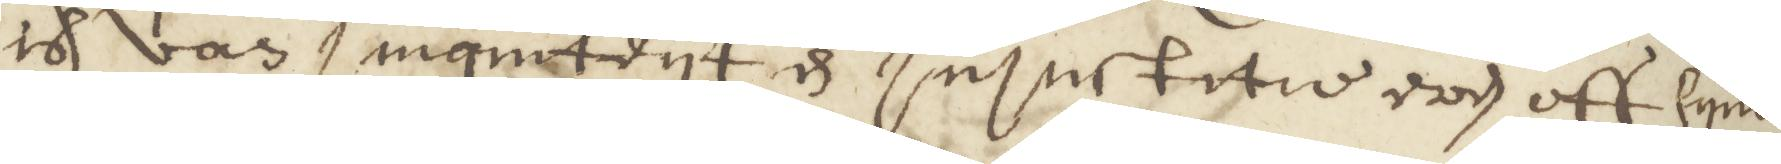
is van jmquiteyt ende jnjustitie van off syne
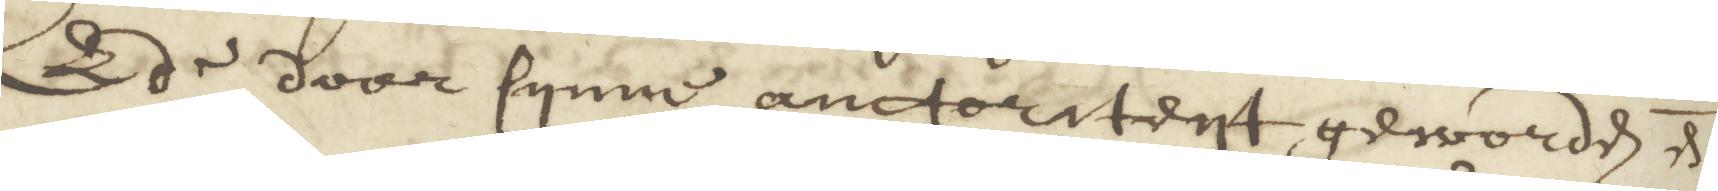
Ed' door synne anctoriteyt geworden ende
